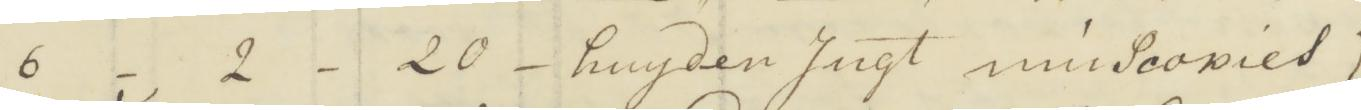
6 - 2 - 20 - huyden Jugt muscopies
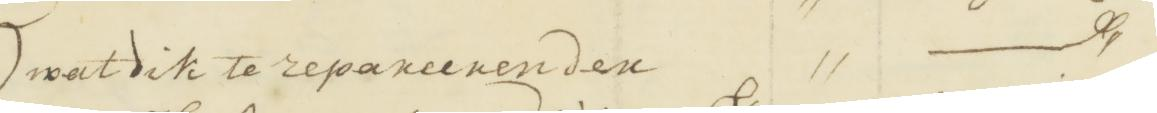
wat dik te repareeren der „ _„o
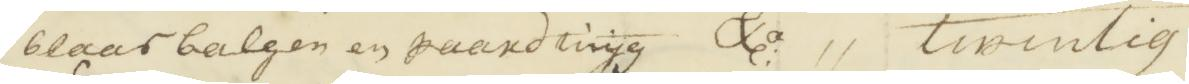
blaas balgen en paardtuijg Et:a „ twintig
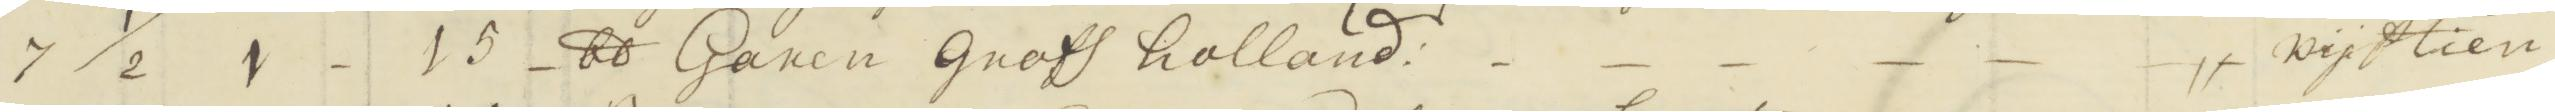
7 ½ 1 - 15 - lb Garen groff holland:s - - - - - - „ vijftien
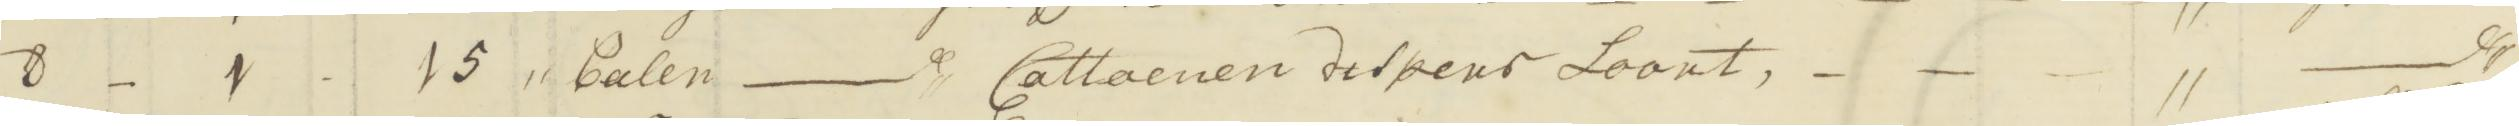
8 - 1 - 15 „ balen _„o Cattoenen dispers soort, - - - „ _„o
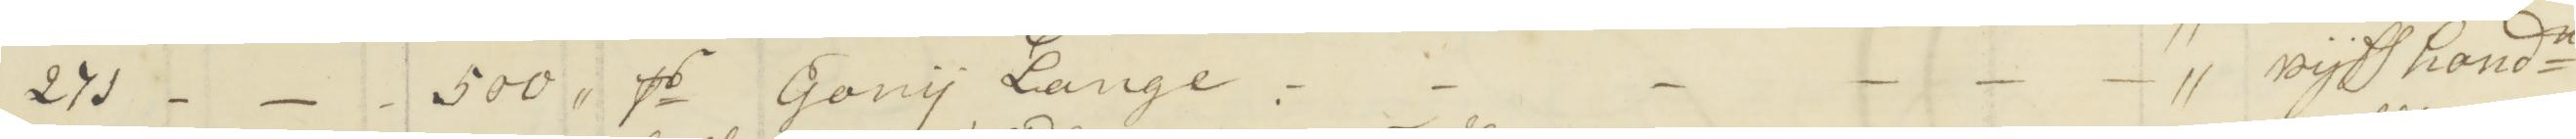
271 - — - 500 „ p=s Gonij Lange - - - - - - „ vijff hond=t
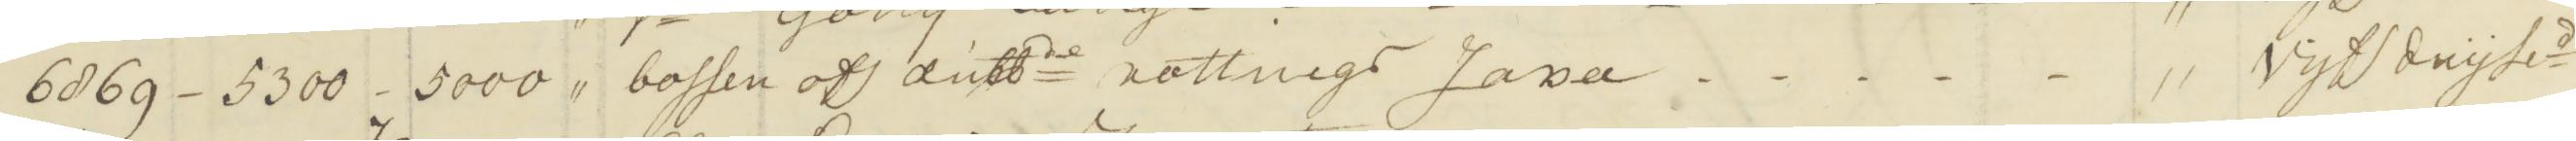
6869 - 5300 - 5000 „ bossen off dubb=de rottings Java - - - - - „ Vijff duijse=d
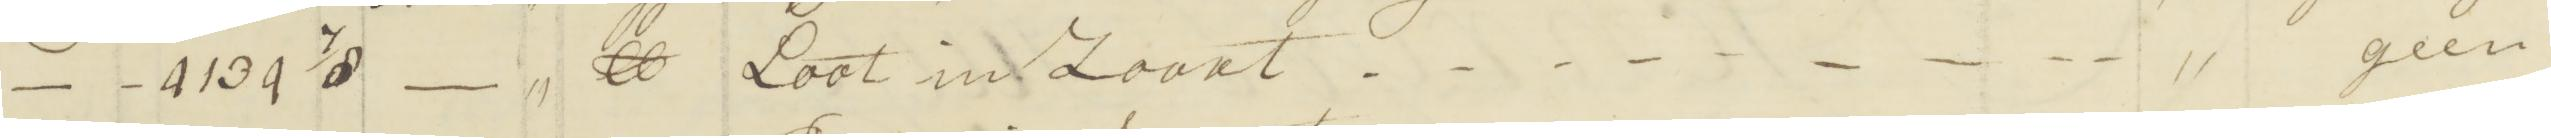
— - 4134 7/8 — „ lb Loot in zoort - - - - - - - - - „ geen
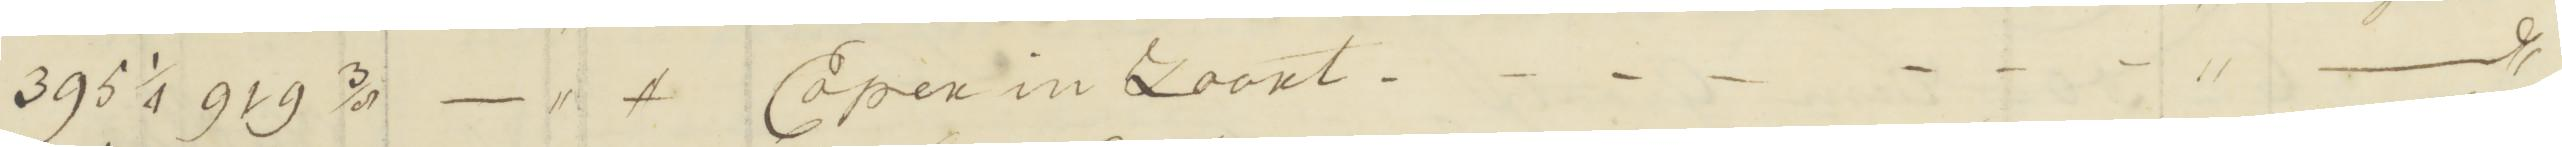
395 ¼ 919 3/8 — „ „ coper in zoort - - - - - - - „ _„o
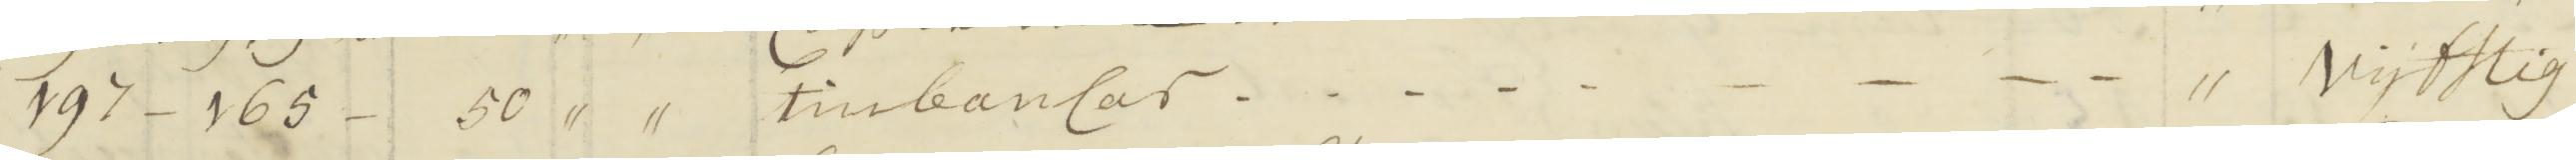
197 - 165 - 50 „ „ tinbancas - - - - - - - - - „ Vijfftig
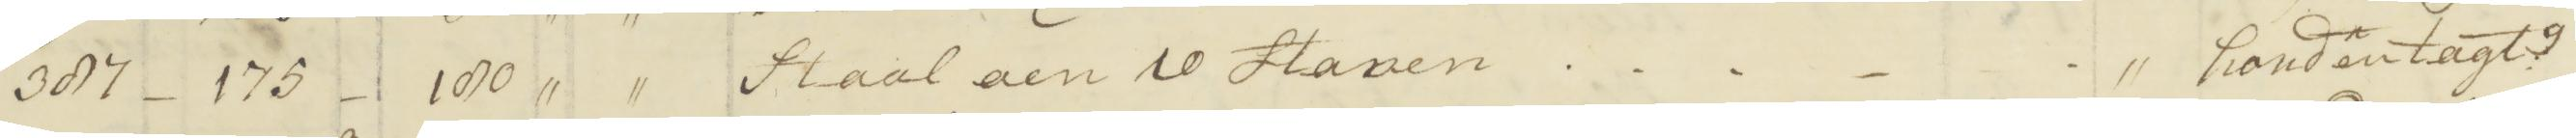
387 - 175 - 180 „ „ staal aen 10 staven - - - - - „ hondt en tagt:g
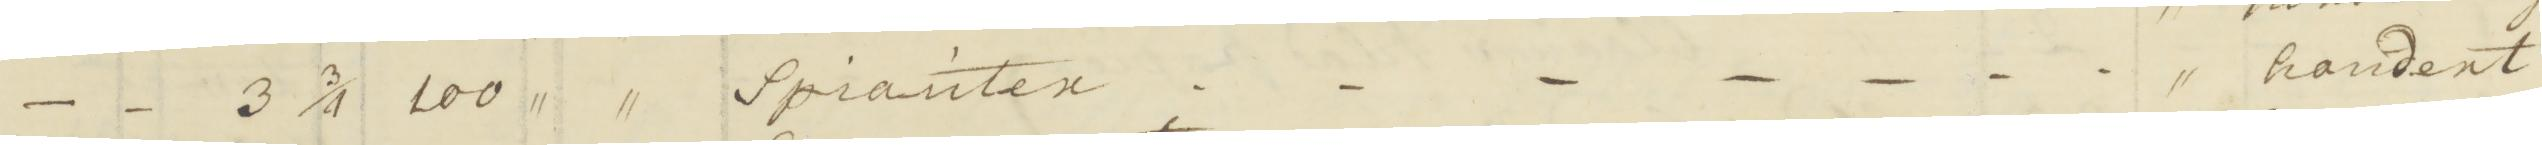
— - 3 ¾ 100 „ „ spiauter - - - - - - - „ hondert
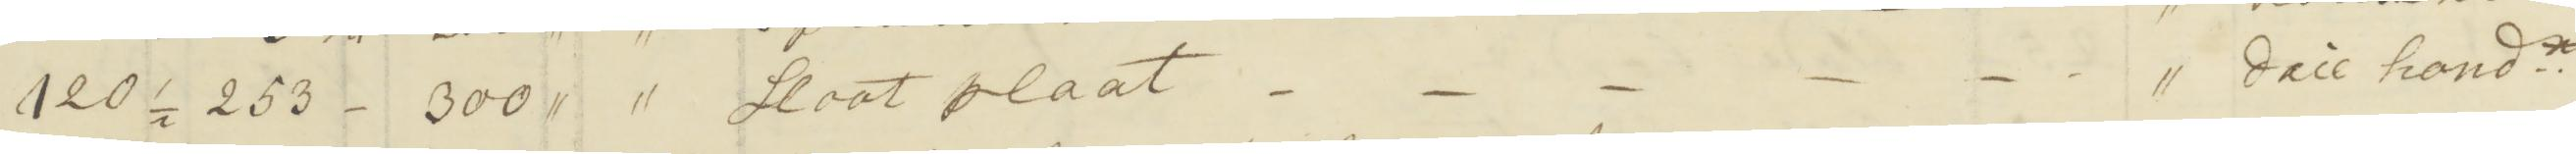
420 ½ 253 - 300 „ „ sloot plaat - - - - - - „ drie hond:rt
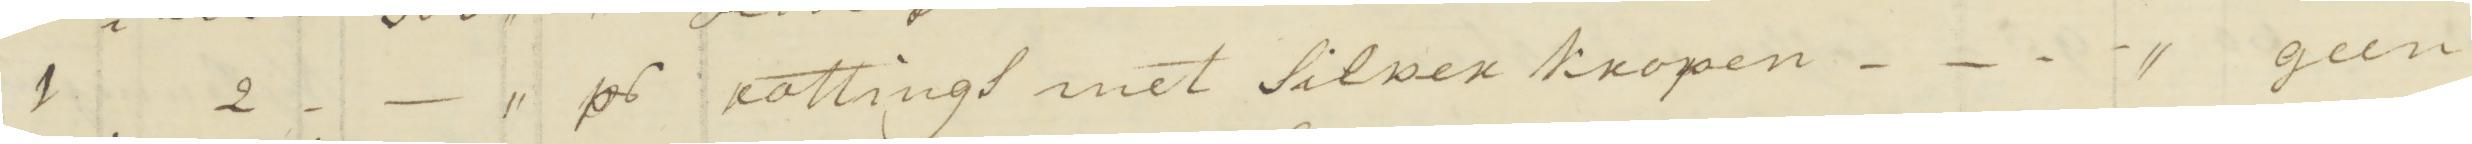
1 2 - — „ ps rottings met silver knopen - - - „ geen
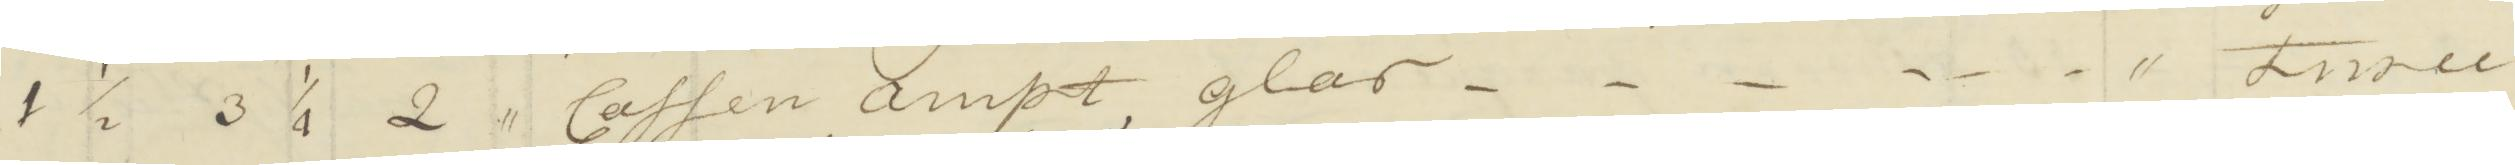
1 ½ 3 ¼ 2 „ cassen ampt, glas - - - - - - „ twee
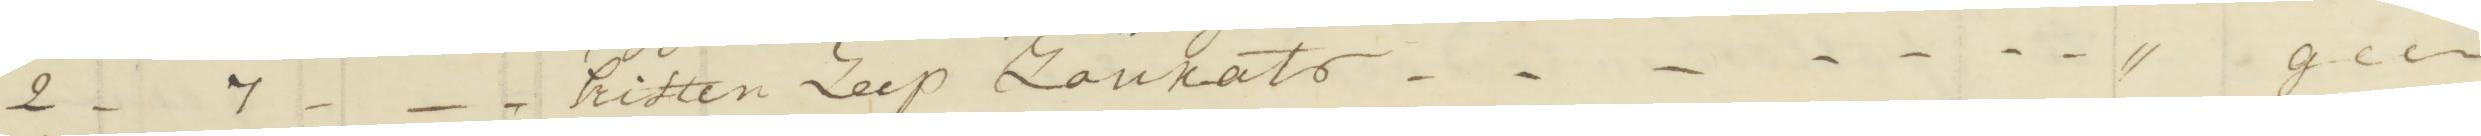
2 - 7 - — „ kisten zeep zourats - - - - - - - „ geen
